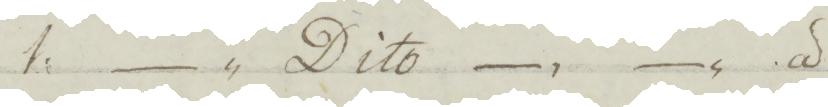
1: —„ Dito —„ —„ a
